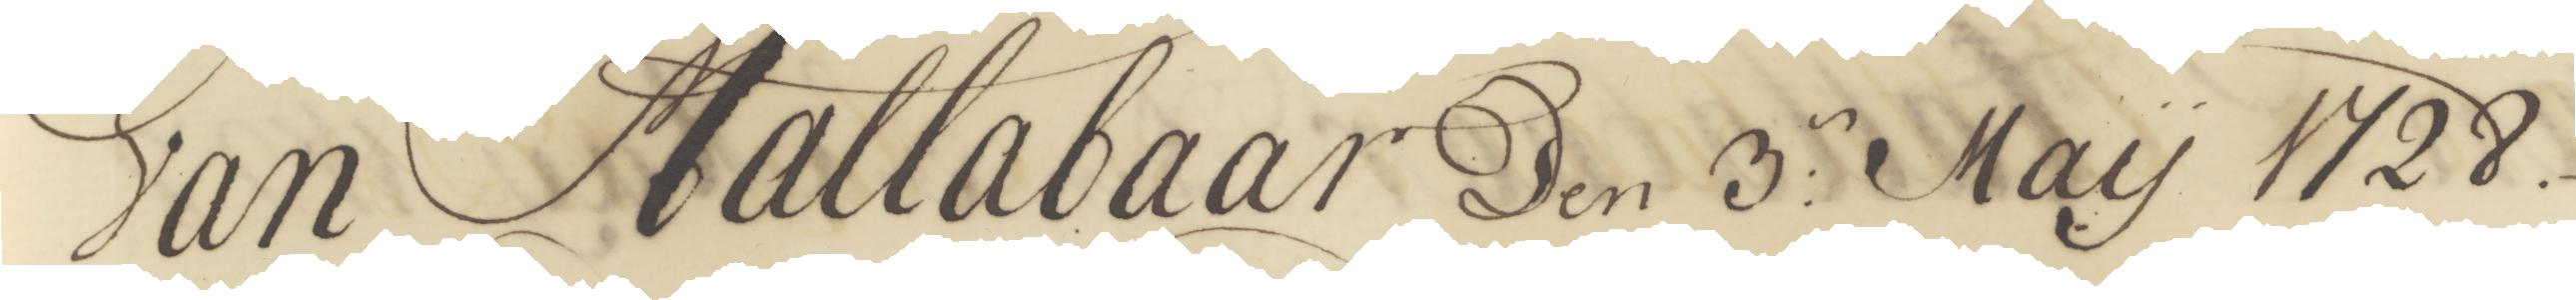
Van Mallabaar Den 3:' Maij 1728.
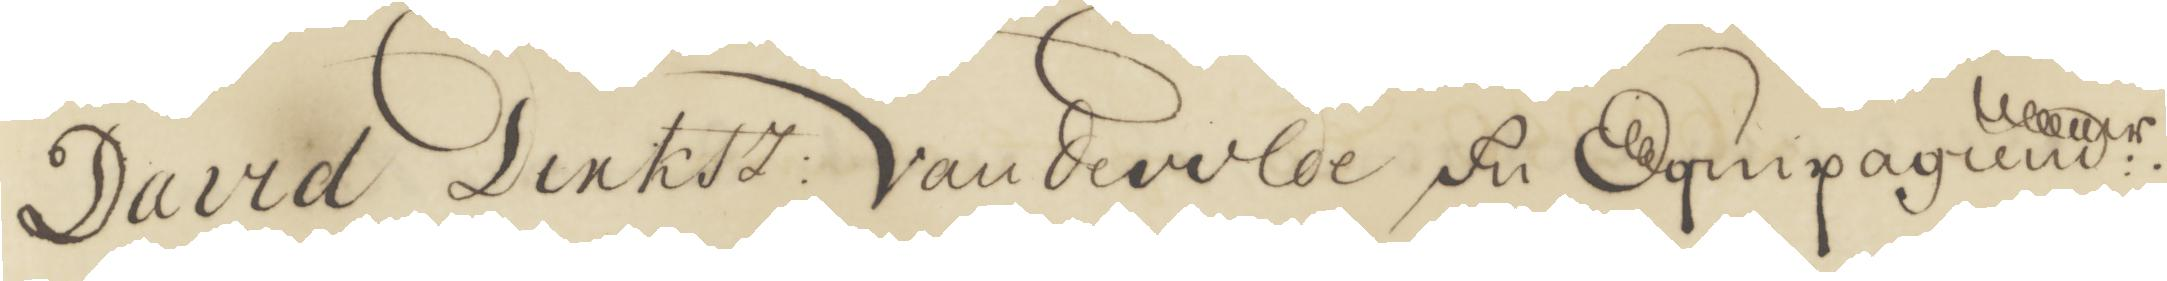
David Dirksz: van develde en Equipagiem:r
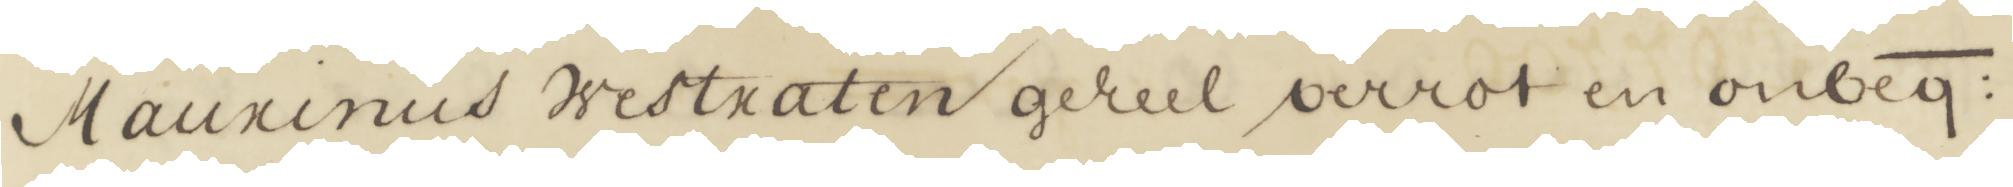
Maurinus Westraten geheel verrot en onbeq:
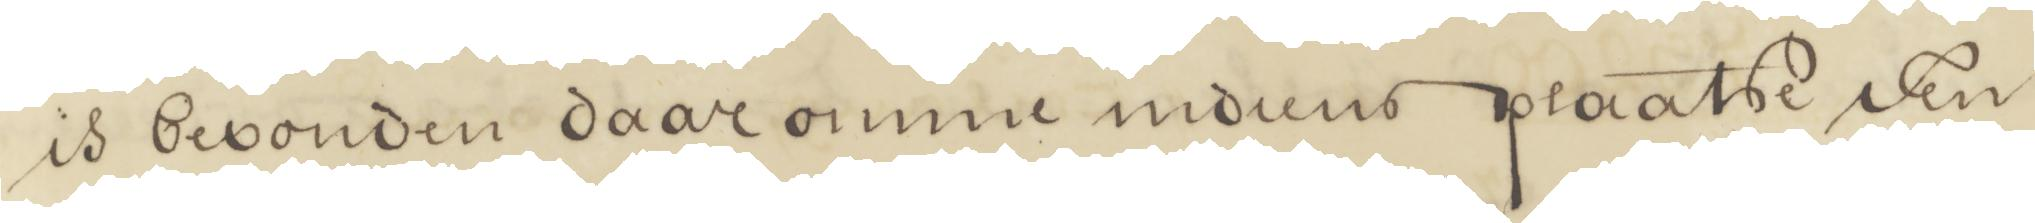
is bevonden daar omme indiens plaatse Een
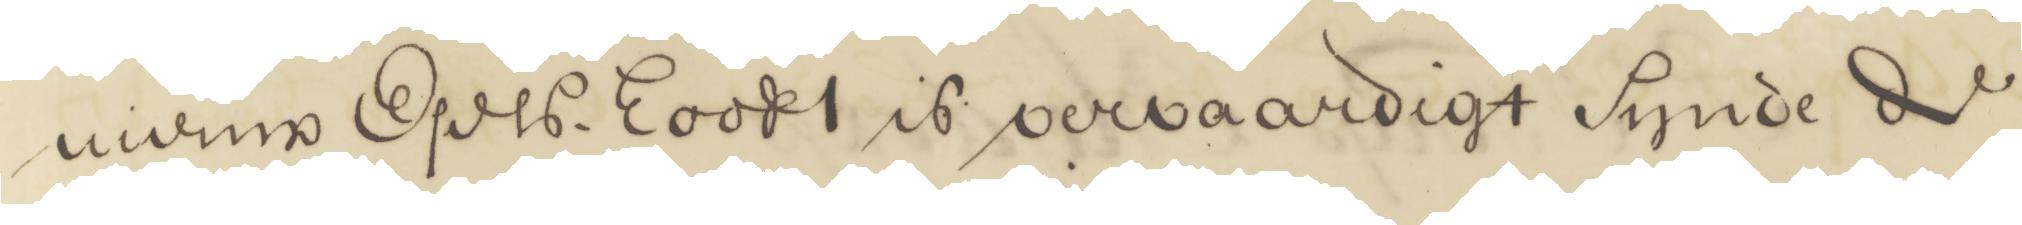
nieuw Esels-hooft is vervaardigt synde de
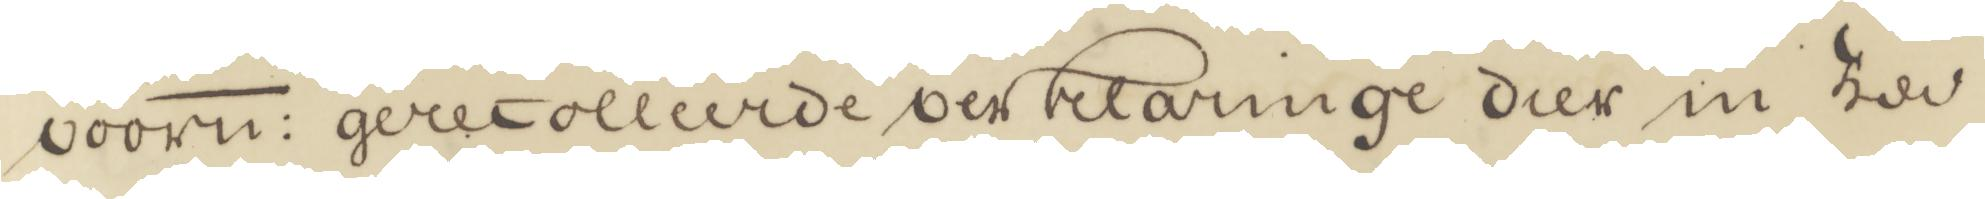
voorn: gerecolleerde verklaringe dier in zee
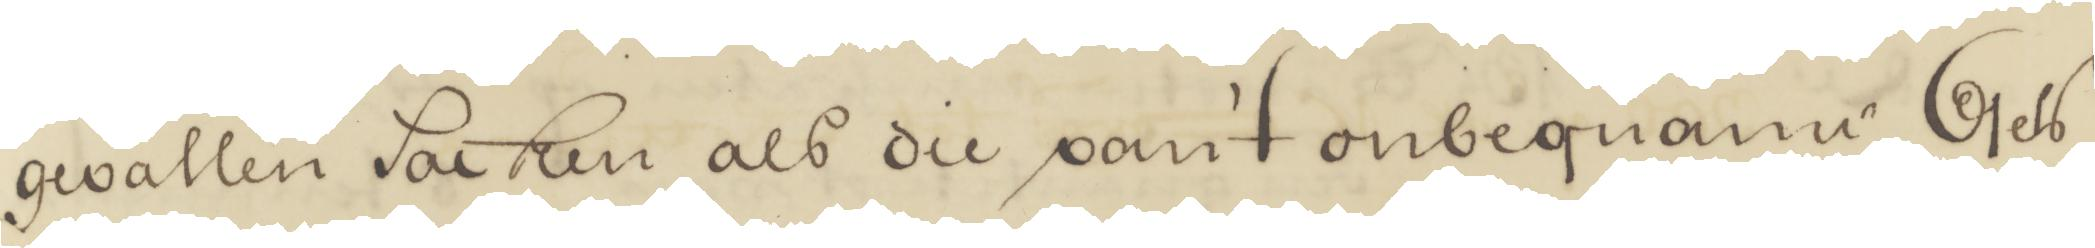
gevallen sacken als die van ’t onbequame Esels
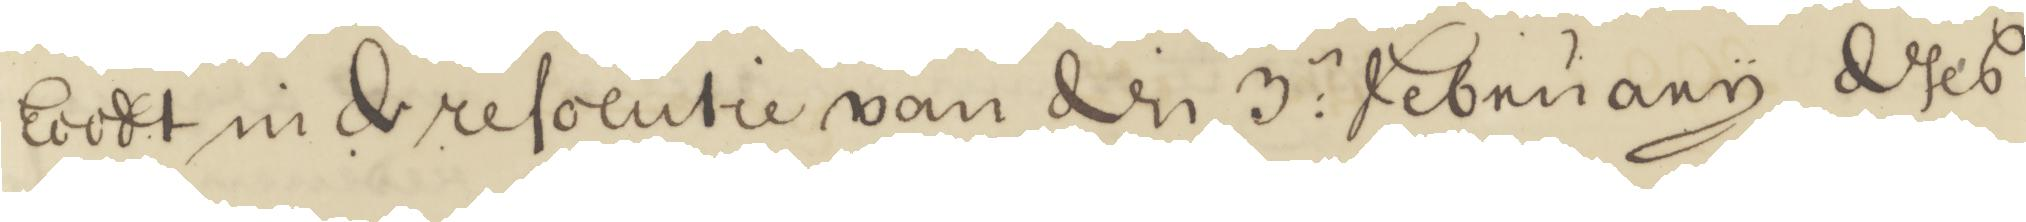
hooft in de resolutie van den 3:' februarij deses
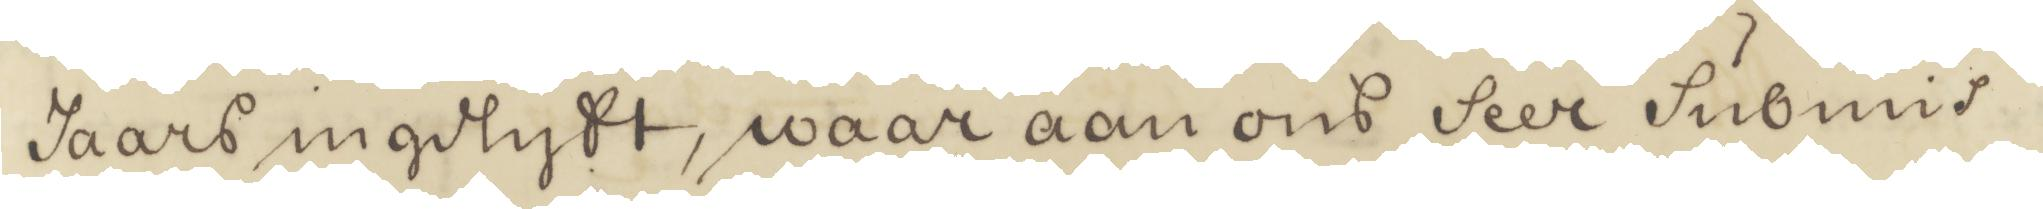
Iaars ingelyft, waar aan ons seer submis
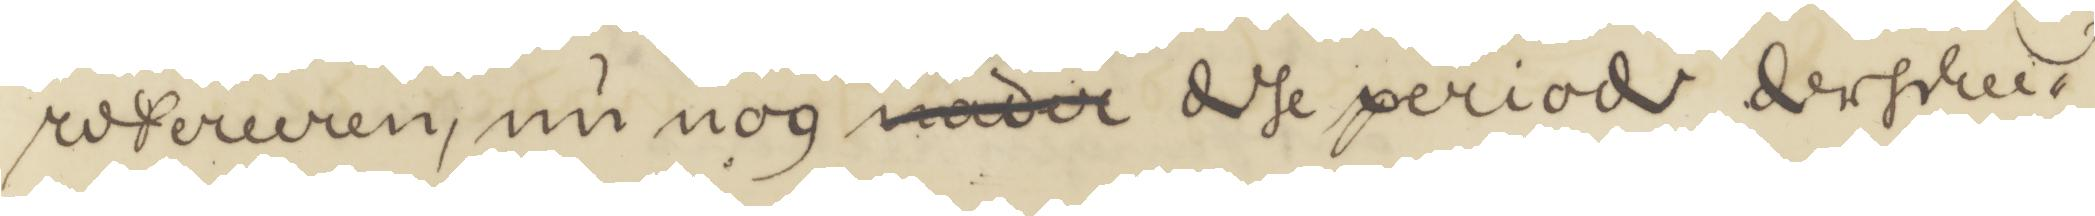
refereeren, nu nog nader dese periode derschee„
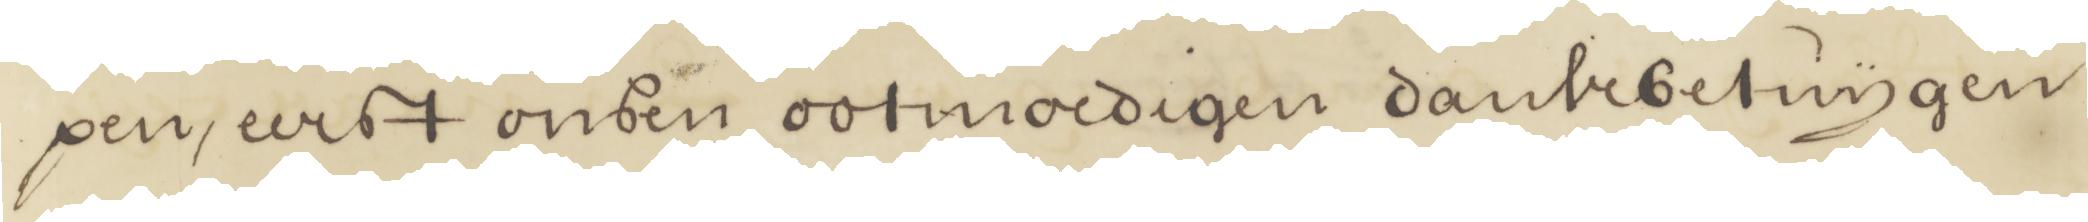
pen, eerst onsen ootmoedigen dankbetuijgen
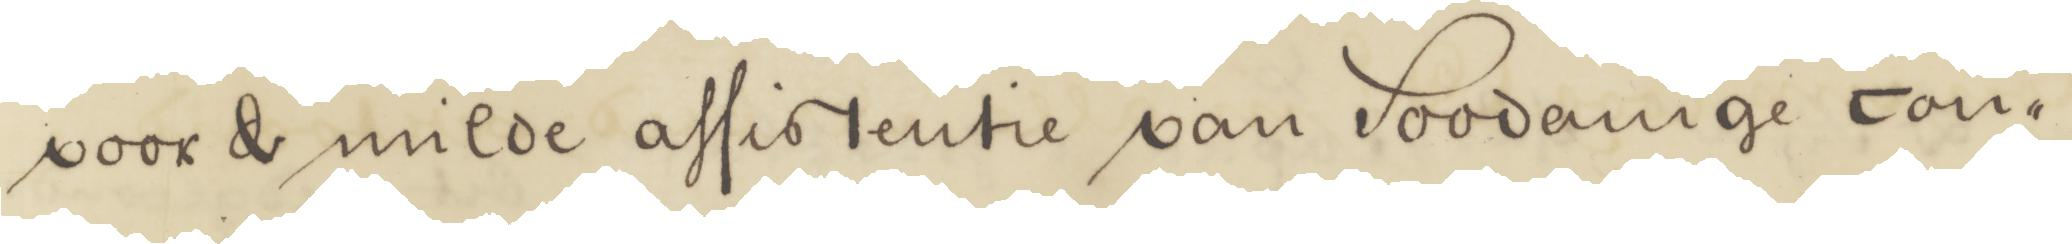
voor de milde assistentie van soodanige con„
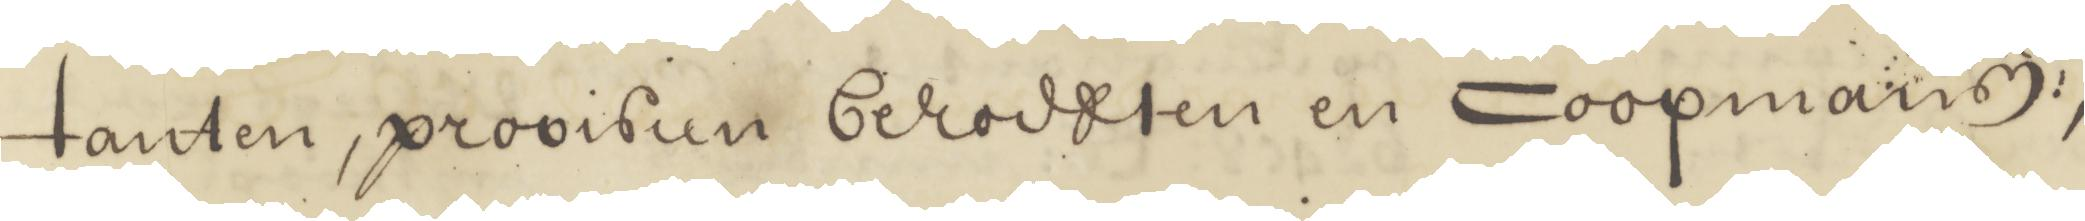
tanten, provisien behoeften en coopmansz:
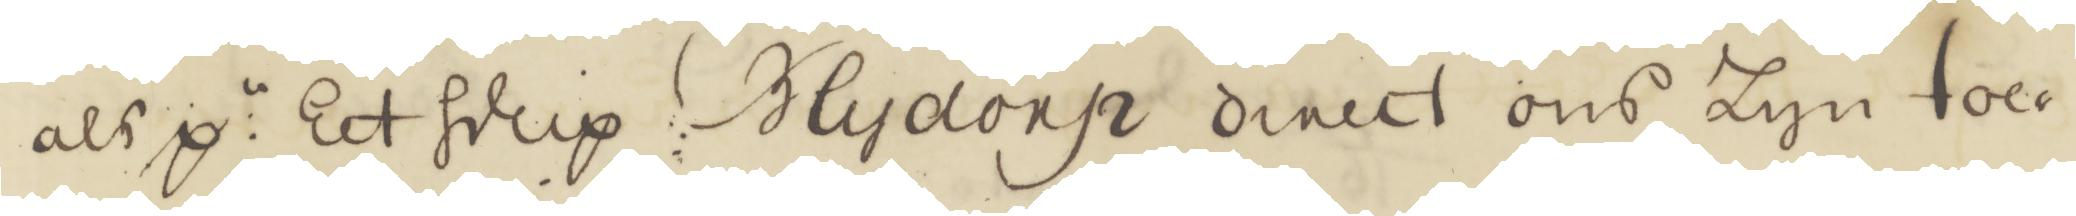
als p:r het schip: Blydorp direct ons zyn toe
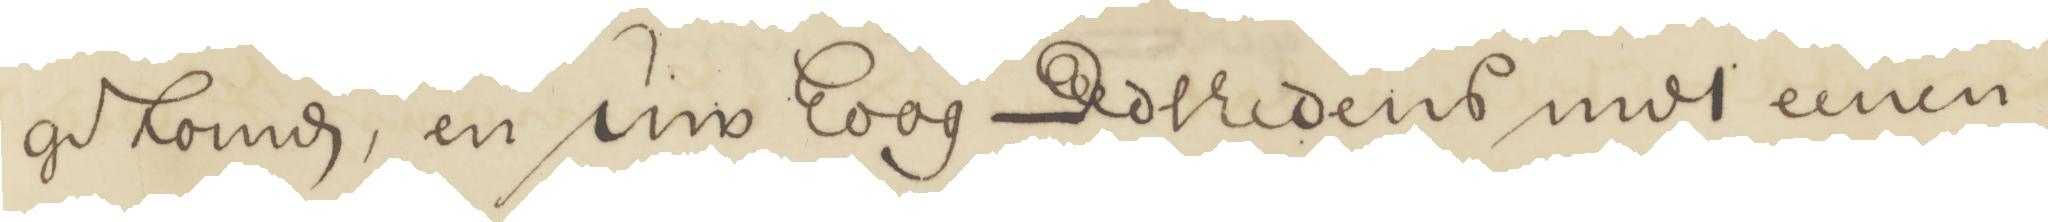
gekomen, en uw hoog Edlhedens met eenen
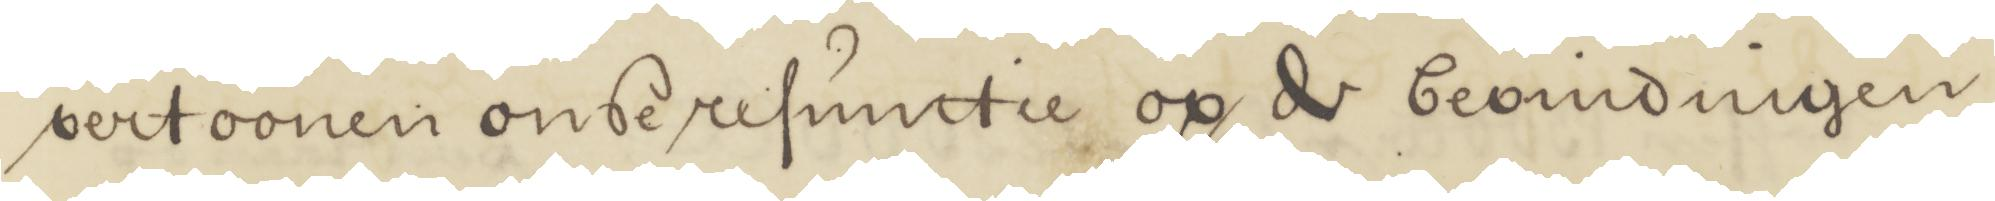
vertoonen onse resumtie op de bevindingen
